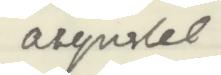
azynstel
